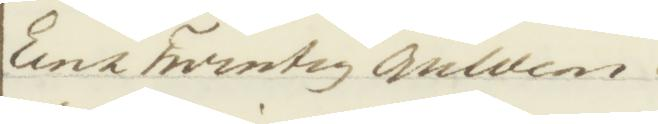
Een & Twintig guldens
